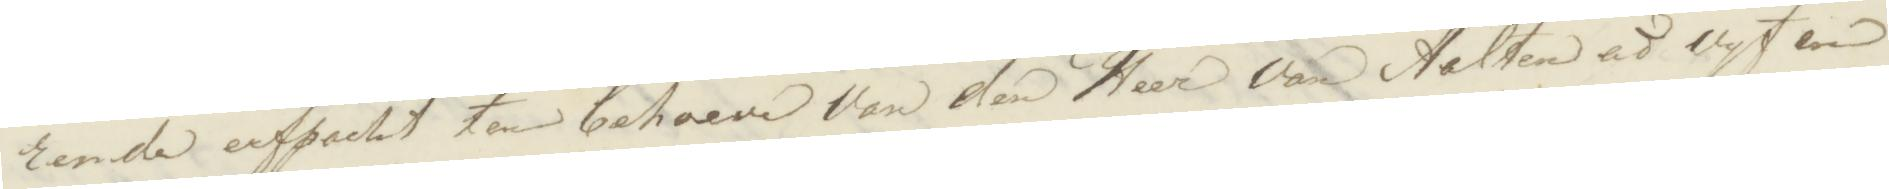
rende erfpacht ten behoeve van den Heer van Aalten ad vyf en
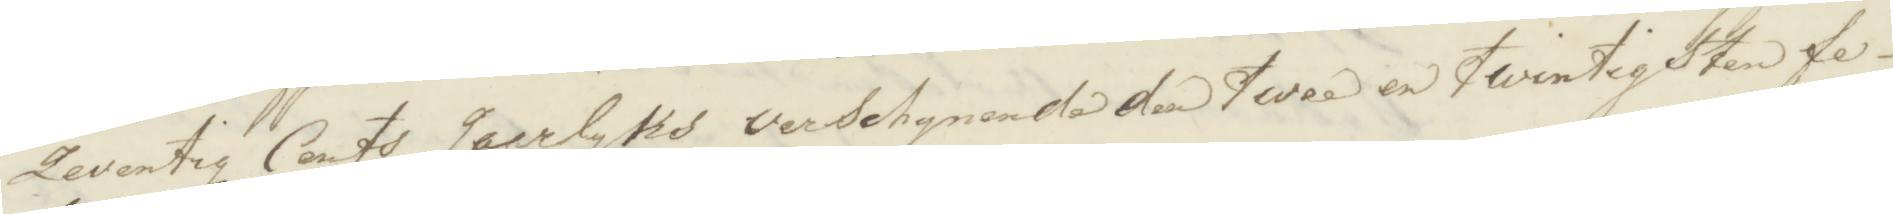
zeventig Cents Jaarlyks verschijnende den twee en twintigsten fe-
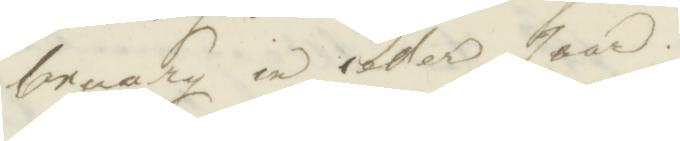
bruary in ieder Jaar.
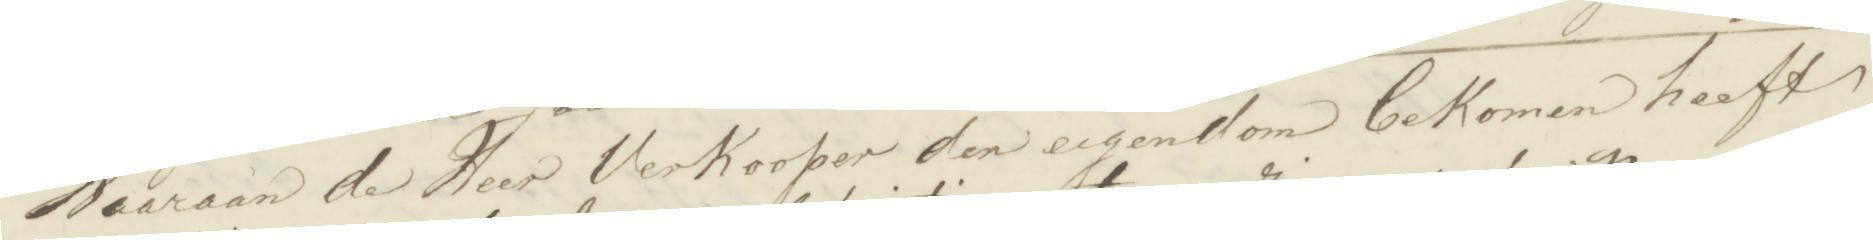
Waaraan de Heer Verkooper den eigendom bekomen heeft
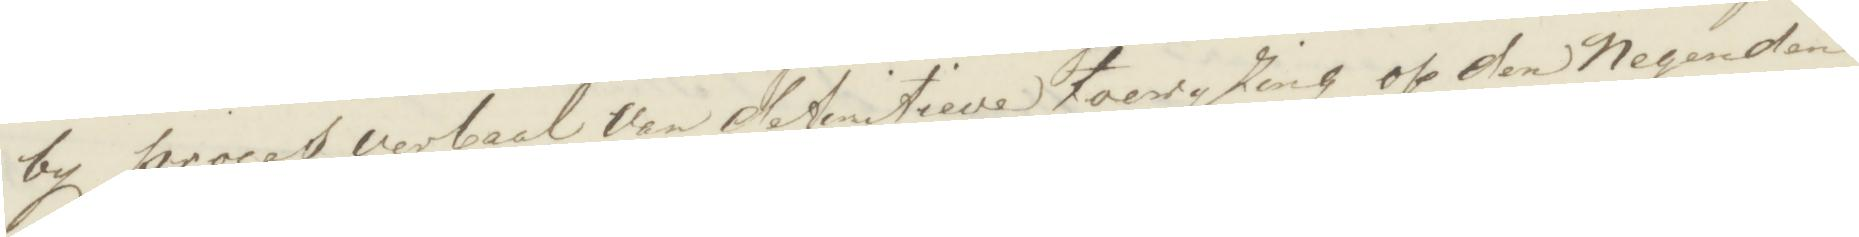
by proces verbaal van definitieve toewyzing op den Negenden
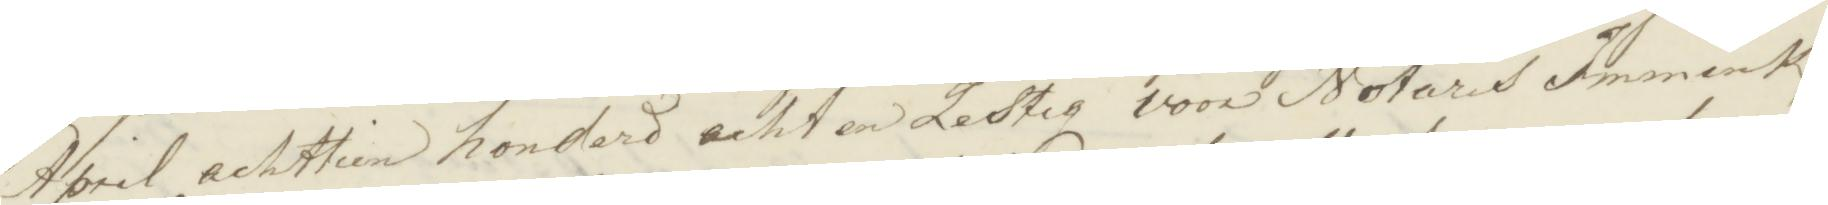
April achttien honderd acht en zestig voor Notaris Immink
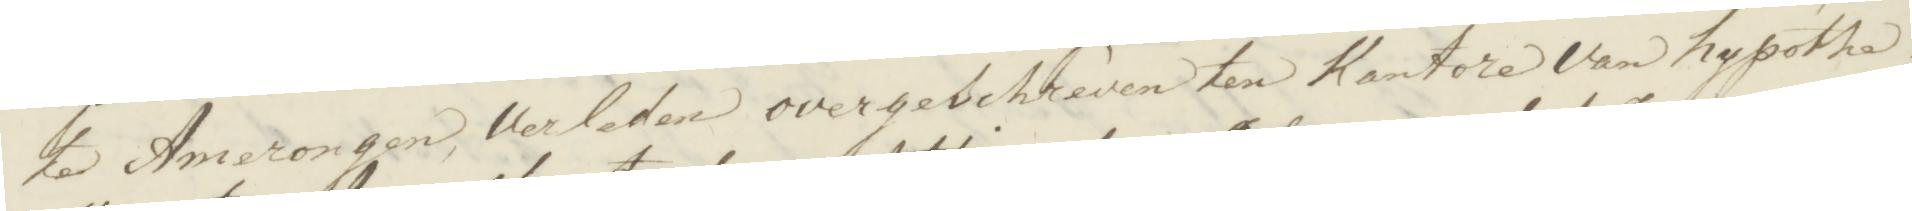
te Amerongen, verleden overgeschreven ten kantore van hypothe
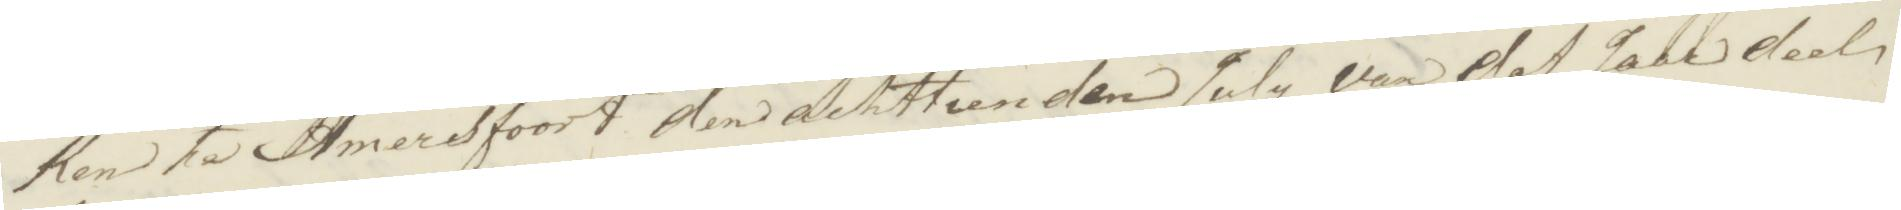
ken te Amersfoort den achttienden July van dat Jaar deel
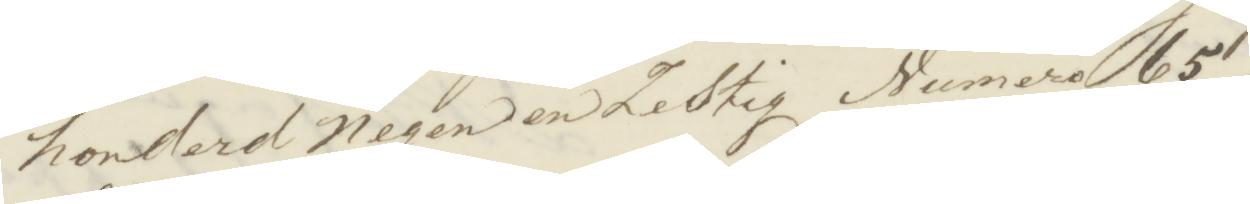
honderd negen en zestig Numero 65.
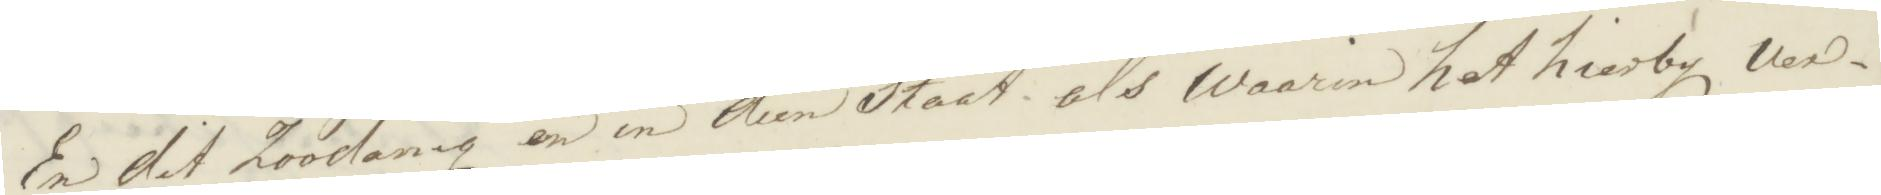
En dit zoodanig en in dien staat als waarin het hierbij ver-
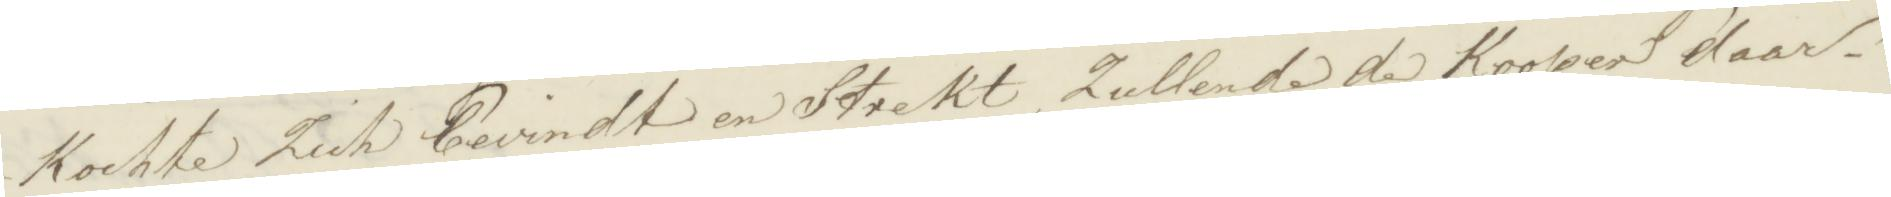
kochte zich bevindt en strekt, zullende de kooper daar-
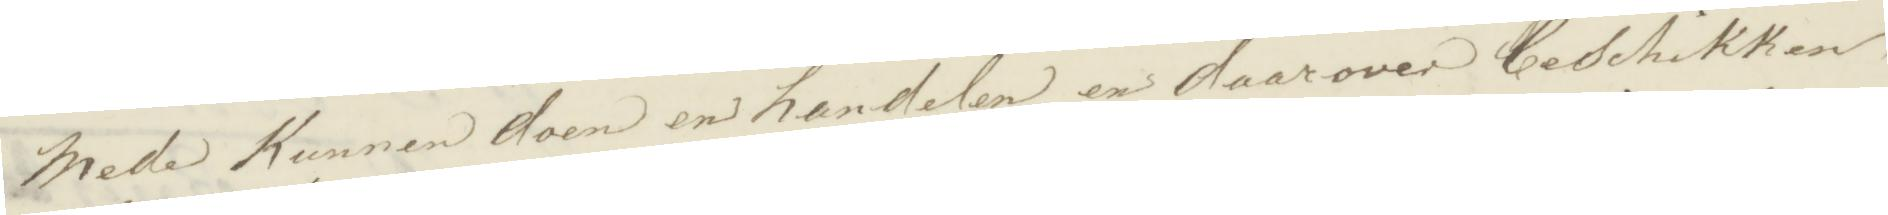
mede kunnen doen en handelen en daarover beschikken
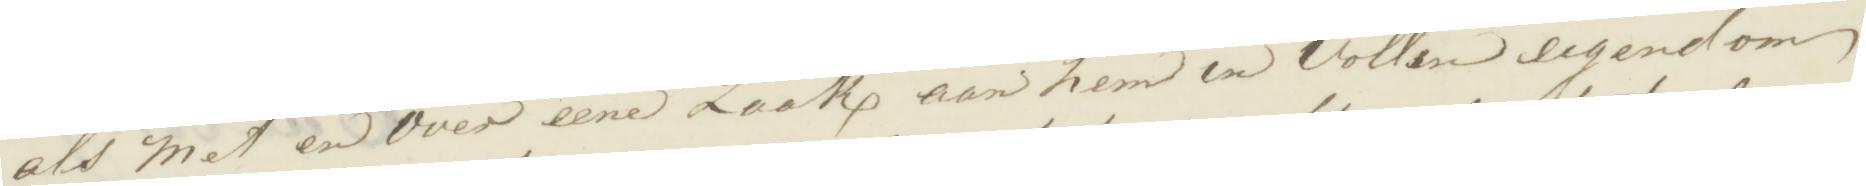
als met en over eene zaak aan hem in vollen eigendom
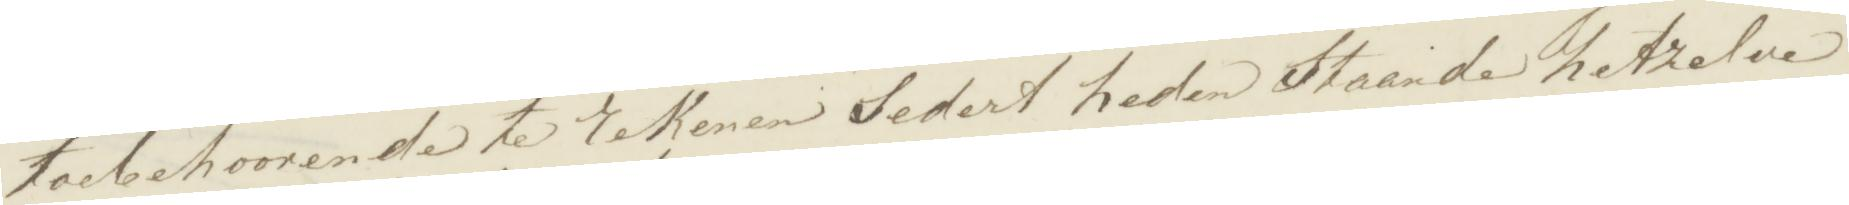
toebehoorende te rekenen sedert heden staande hetzelve
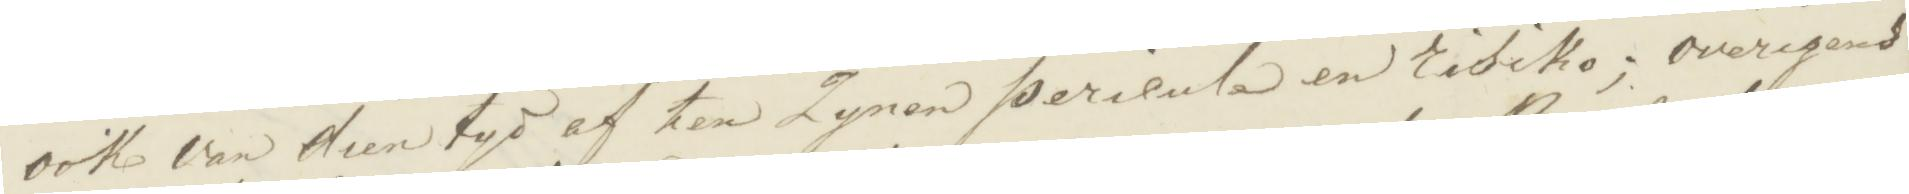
ook van dien tyd af ten zynen pericule en risiko; overigens
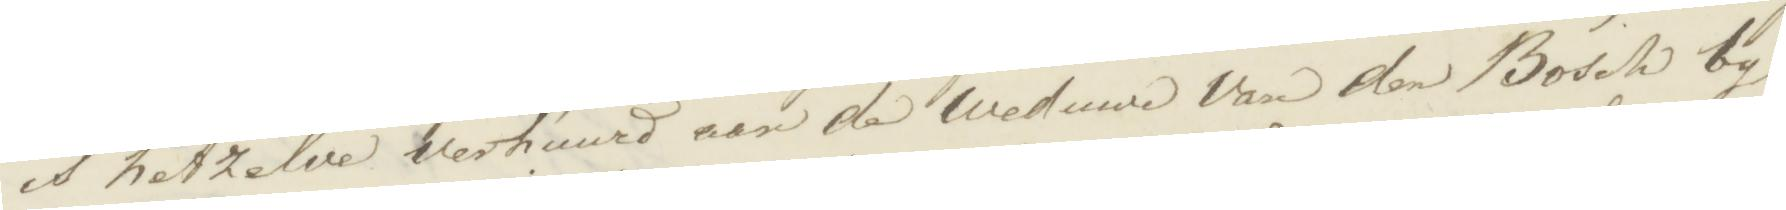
is hetzelve verhuurd aan de weduwe van den Bosch by
